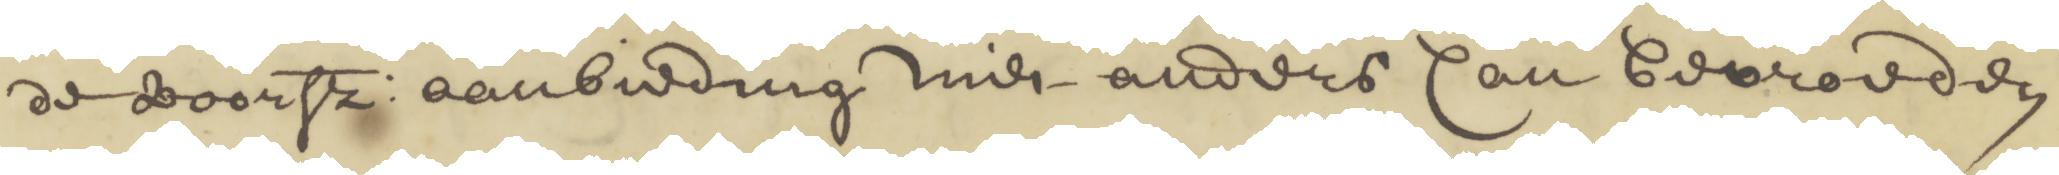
de voorsz: aanbieding niet anders can bevroeden
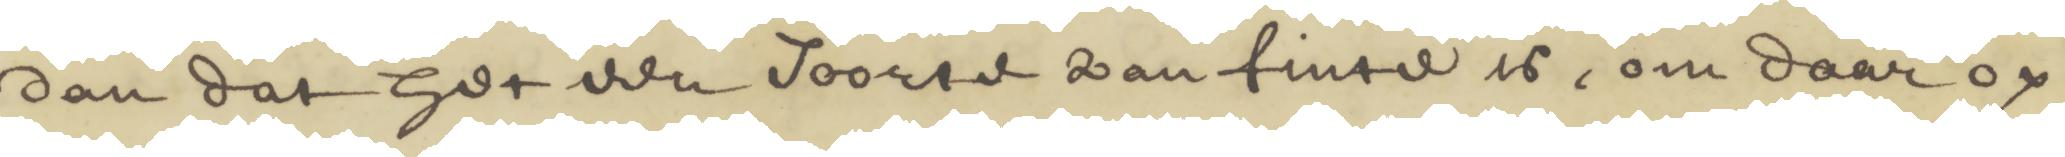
dan dat het een soorte van finte is, om daar op
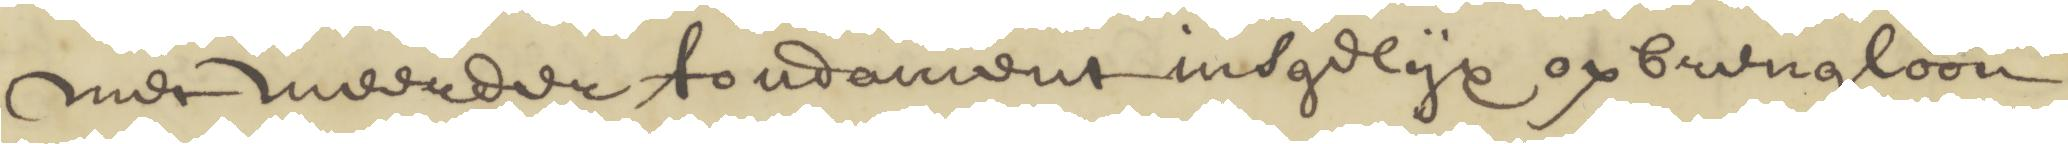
met meerder fondament insgelijx opbrengloon
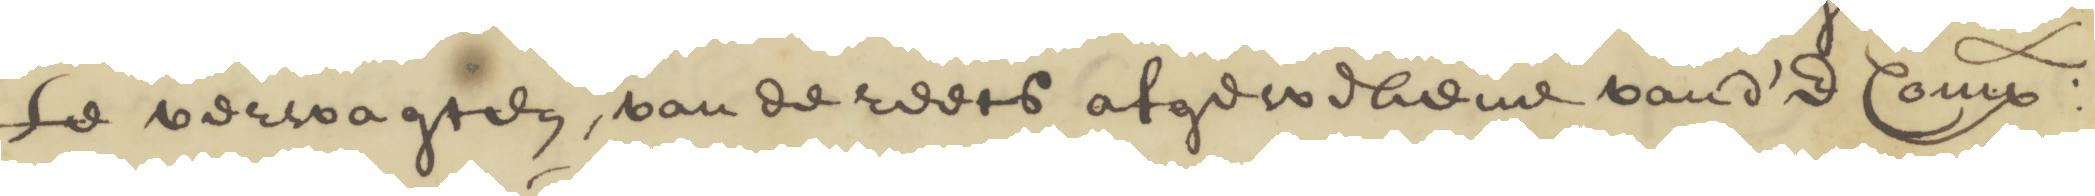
te verwagten, van de reets afgewekene van d’E Comp:
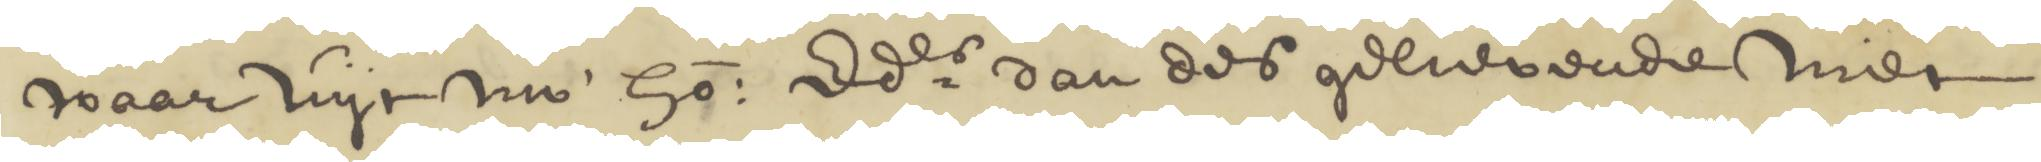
waar uijt uw ho: Ed=ls dan des gelievende niet
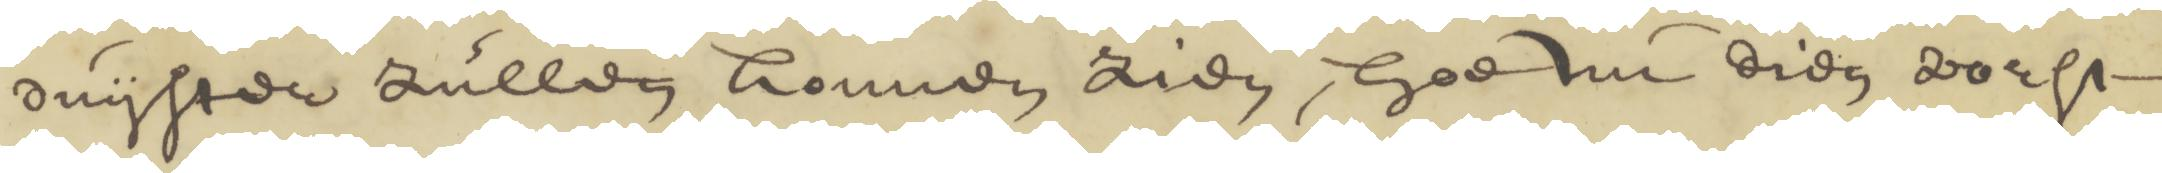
duijster zullen konnen zien, hoe nu dien vorst
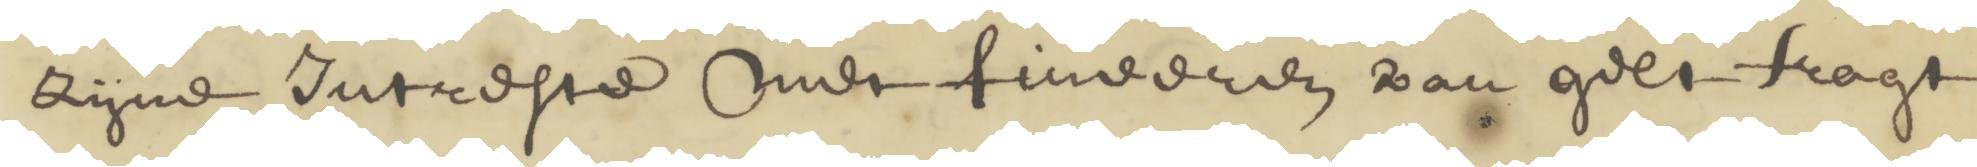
zijne Intreste met fineeren van gelt tragt
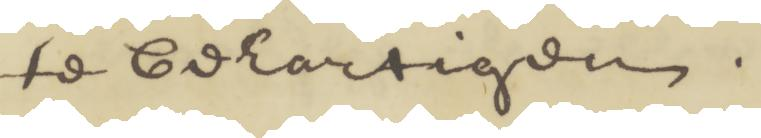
te behartigen.
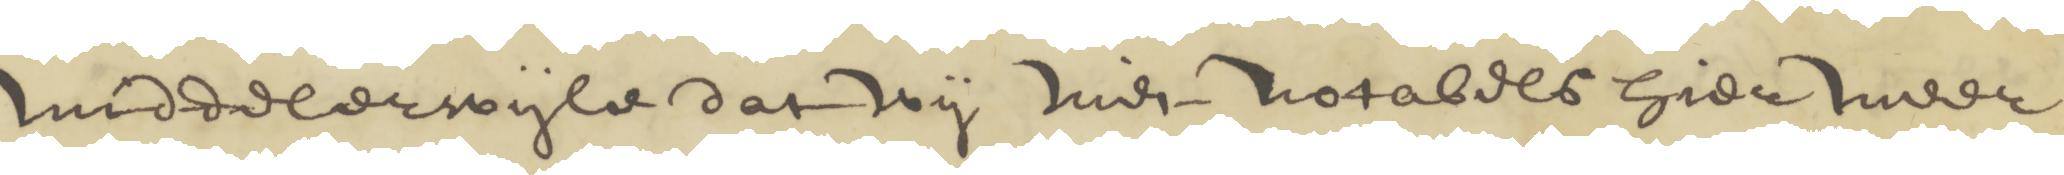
middelerwijle dat wij niet notabels hier meer
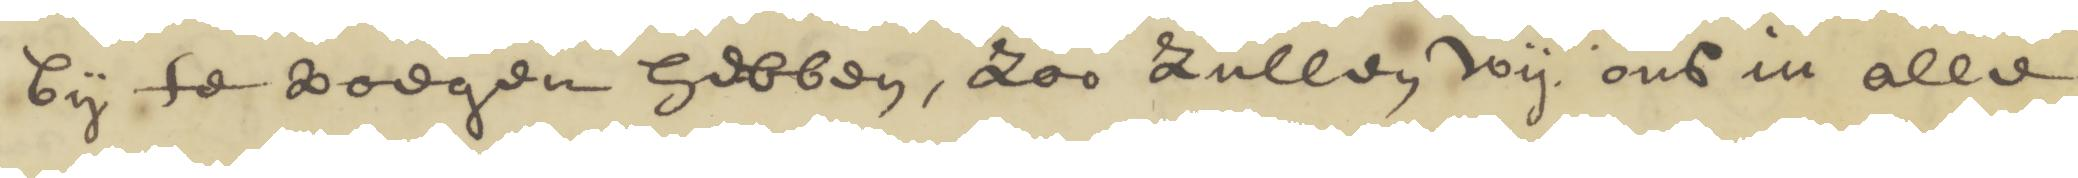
bij te voegen hebben, zoo zullen wij ons in alle
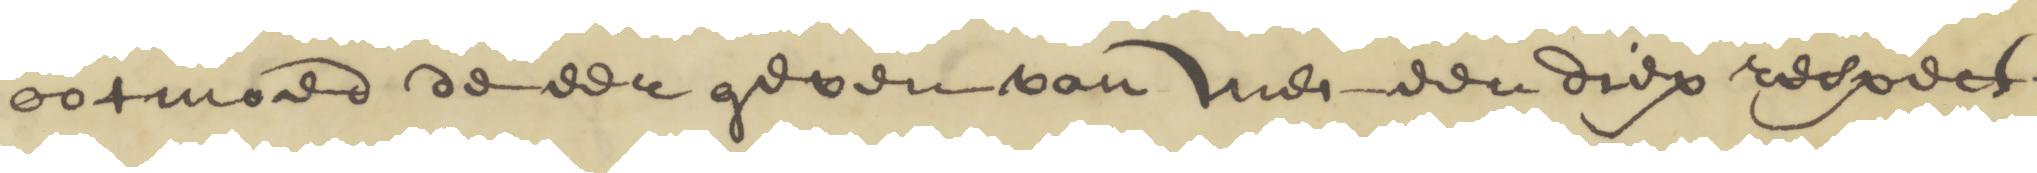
ootmoed de eer geven van met een diep respect
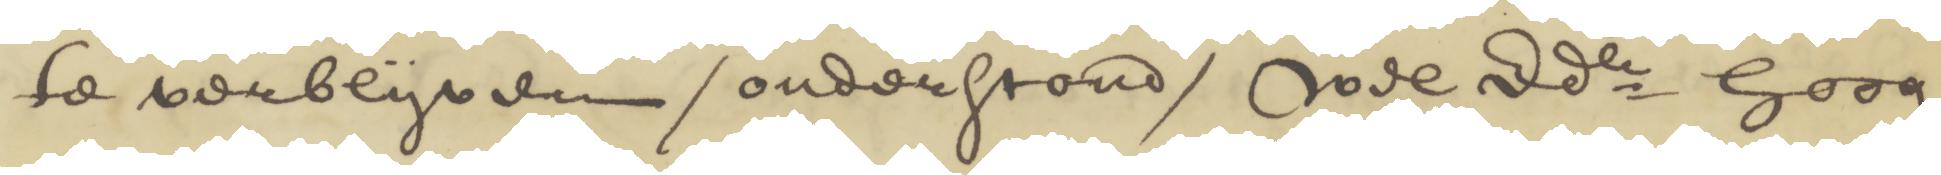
te verblijven /onderstond/ wel Ed=le hoog
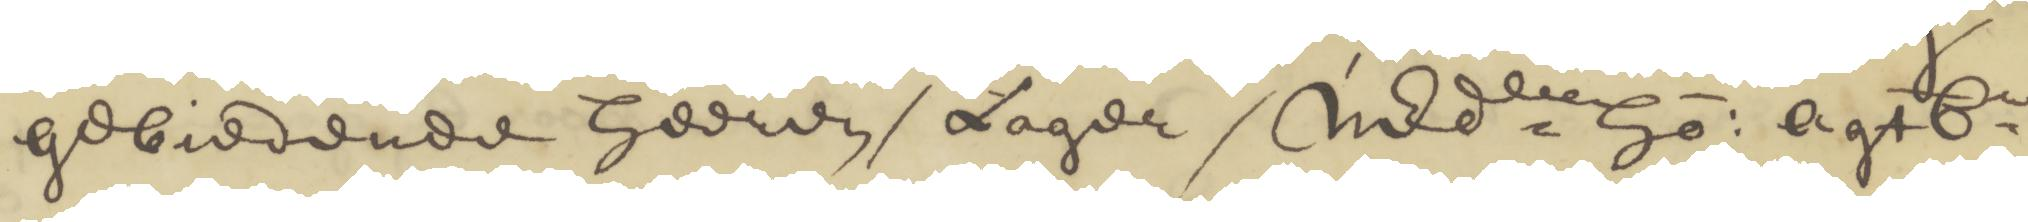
gebiedende heeren / lager/ uEd=le Ho: agtb=re
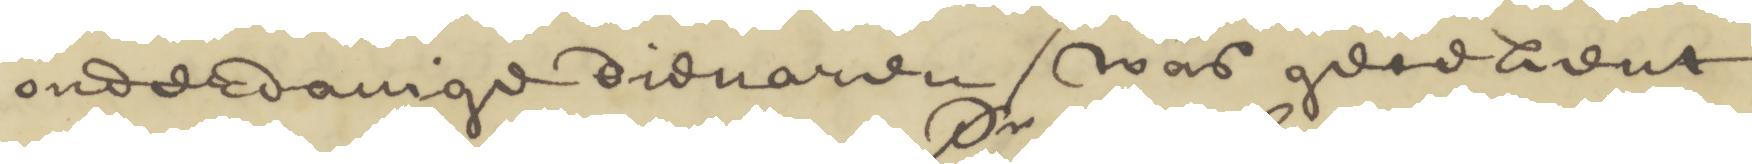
onderdanige dienaren /was getekent)
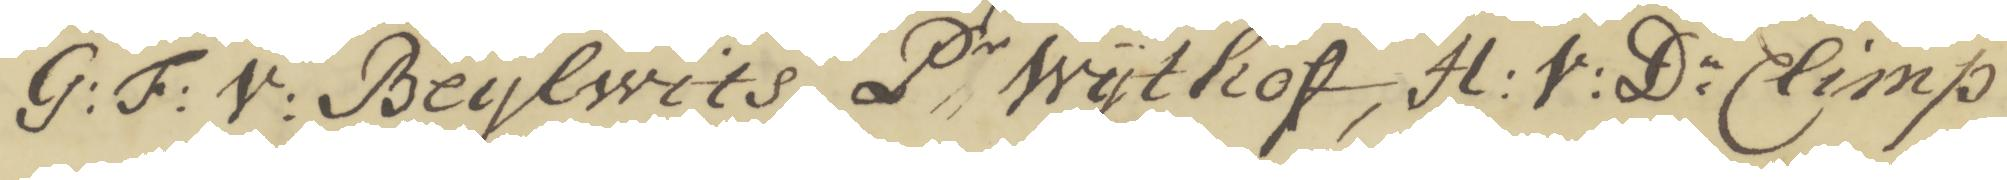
G: F: V: Bijlwits, P„r Wijthof, H: V: D:n Climp
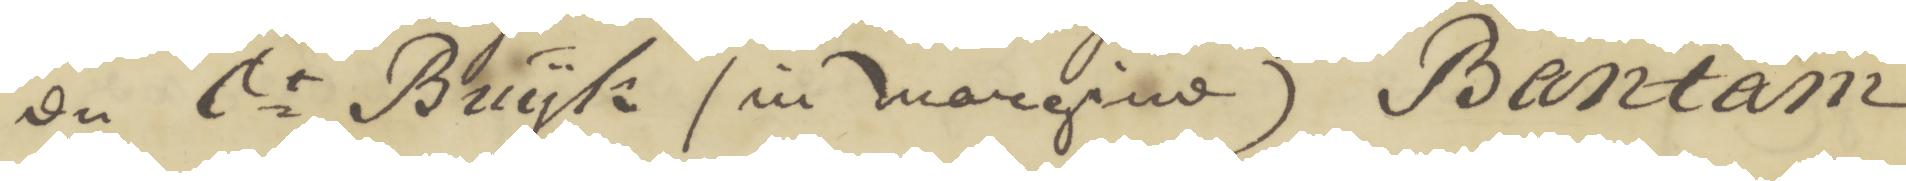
en C=t Buijk (in margine) Bantam
